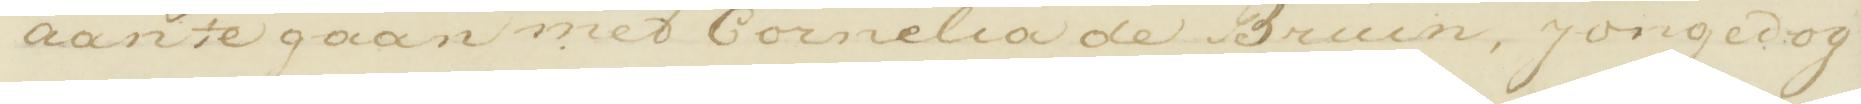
aan te gaan met Cornelia de Bruin, Jongedog
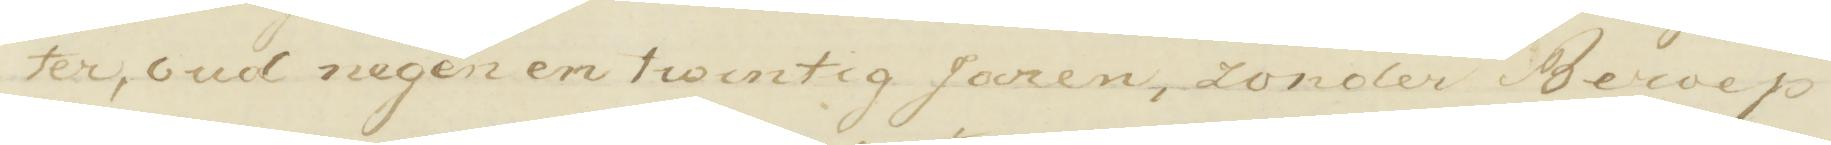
ter, oud negen en twintig Jaren, zonder Beroep
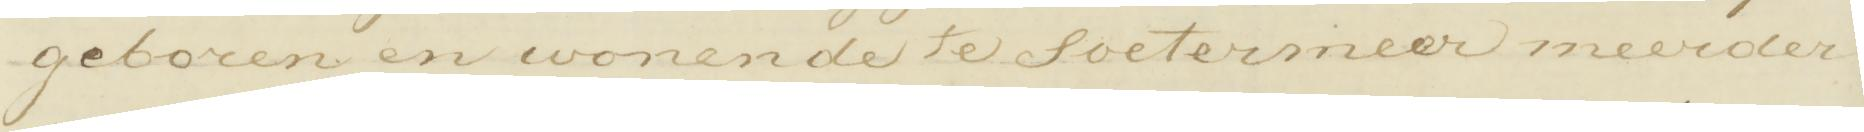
geboren en wonende te soetermeer meerder
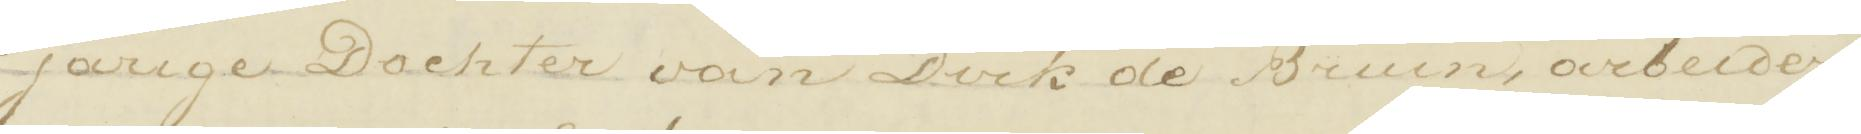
jarige Dochter van Dirk de Bruin, arbeider
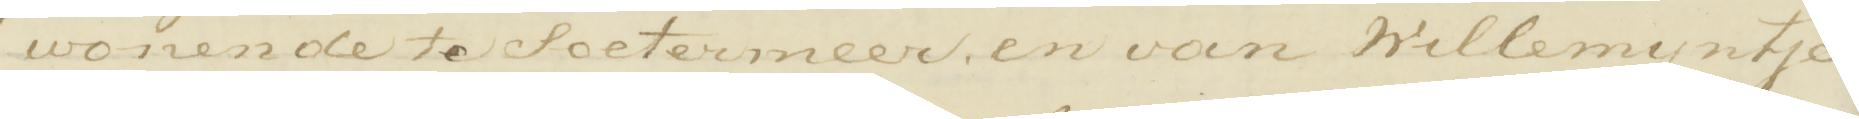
wonende te soetermeer, en van Willemyntje
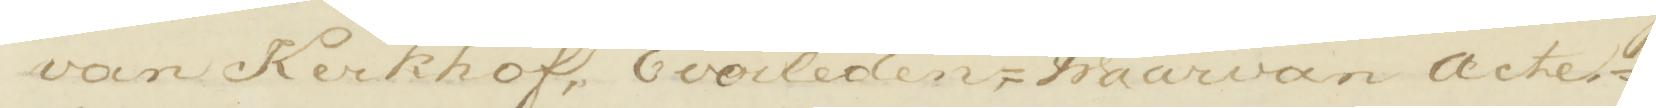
van Kerkhof, overleden = Waarvan Acte =
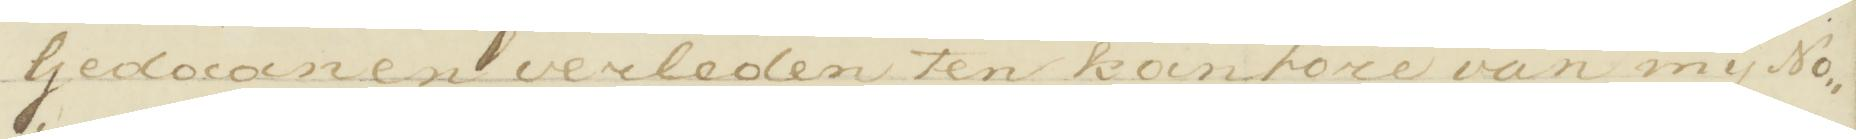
Gedaan en verleden ten kantore van my No„
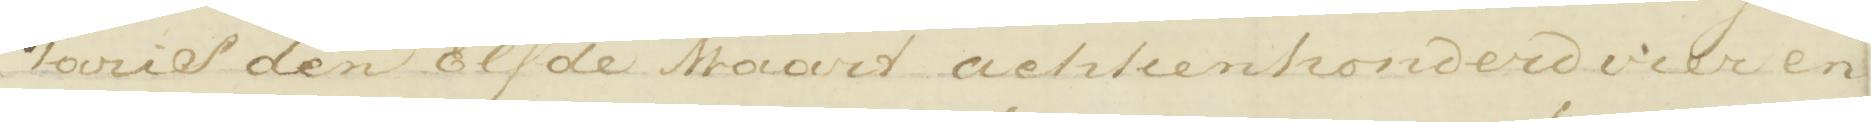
taris den Elf de Maart achtienhonderd vier en
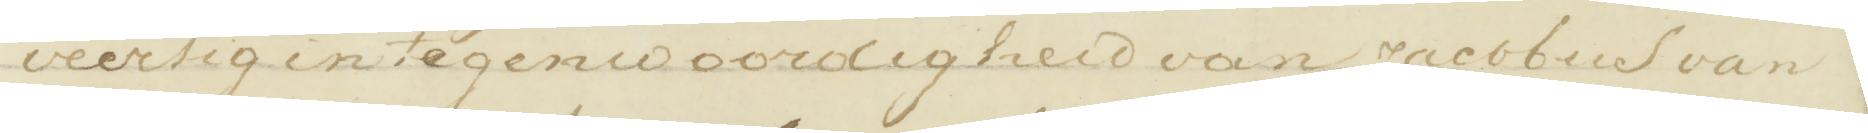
veertig in tegenwoordigheid van Jacobus van
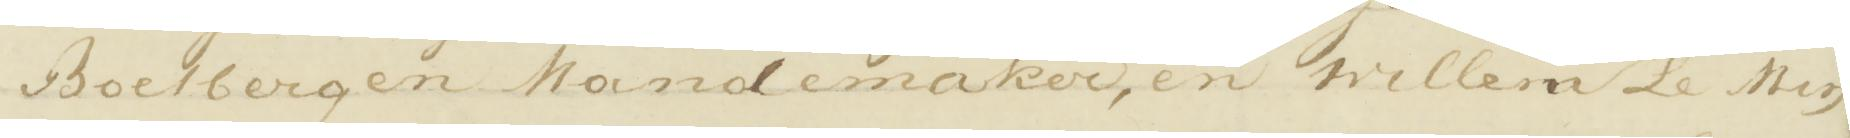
Boetbergen Mandemaker, en Willem Le Min
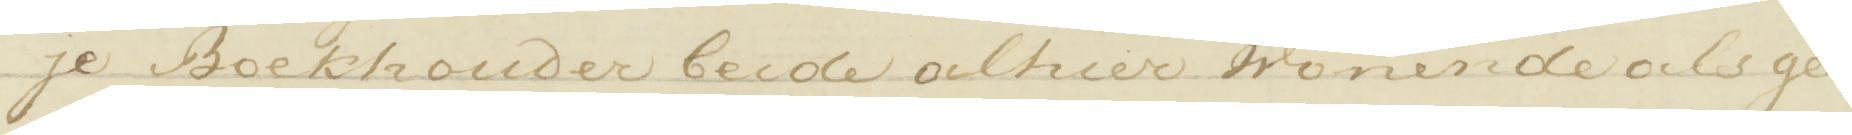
je Boekhouder beide alhier wonende als ge
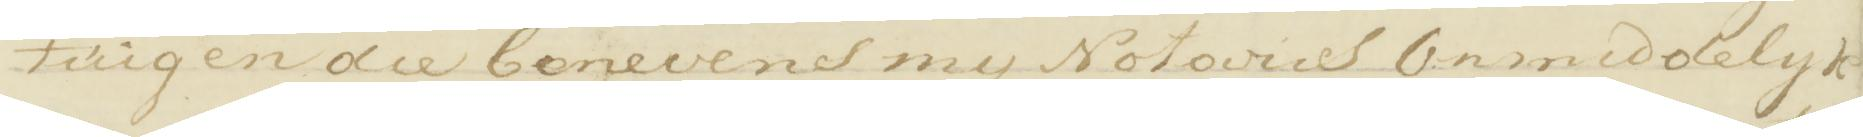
tuigen die benevens my Notaris Onmiddelyk
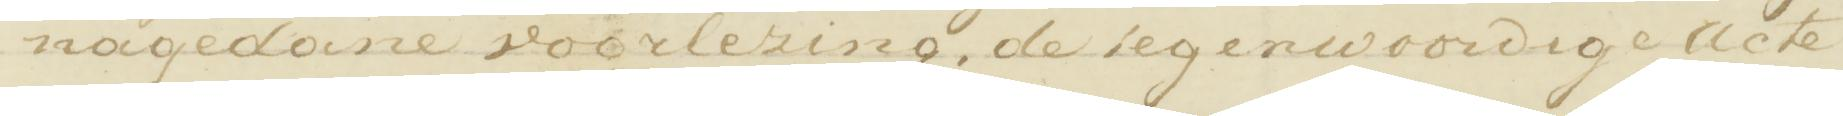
nagedane voorlezing, de tegenwoordige Acte
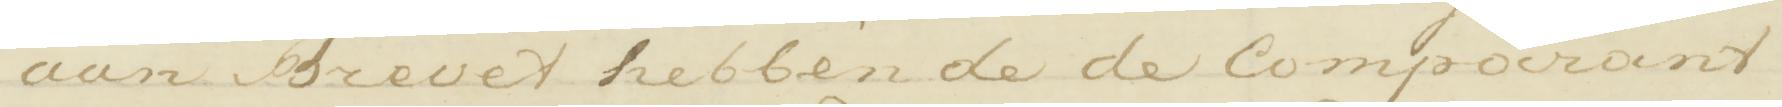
aan Brevet hebbende de Comparant
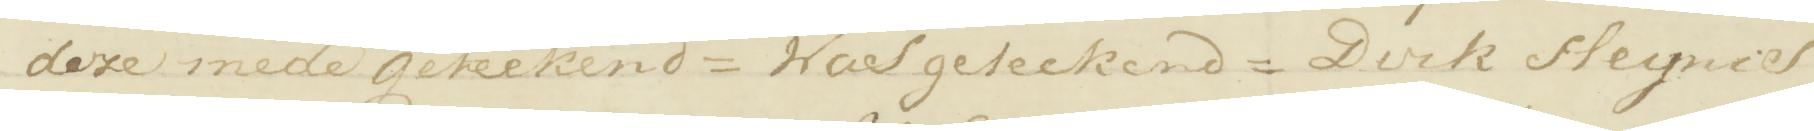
deze mede geteekend = Was geteekend = Dirk Heynis
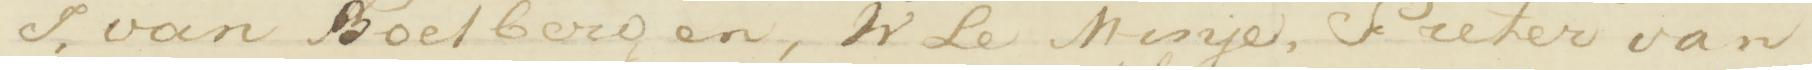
J, van Boetberg en, W Le Minje, Pieter van
